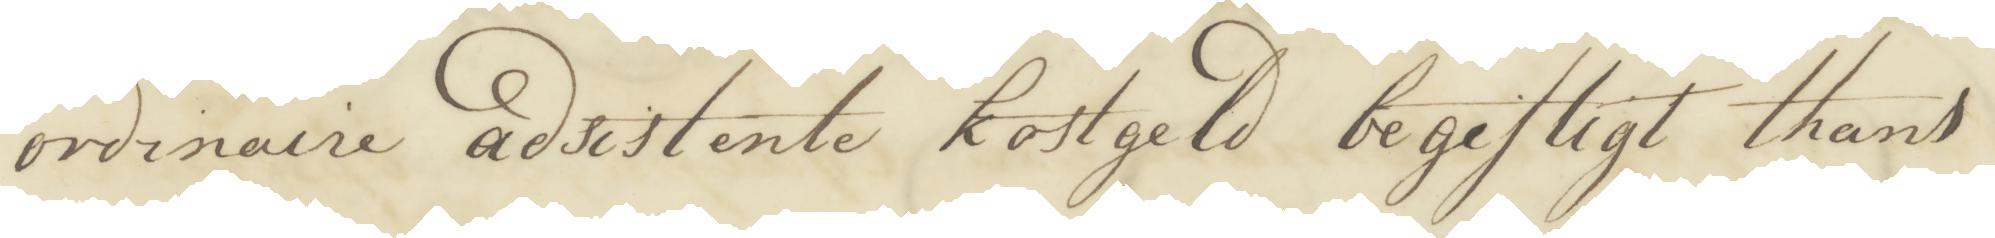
ordinaire adsistente kostgeld begiftigt thans
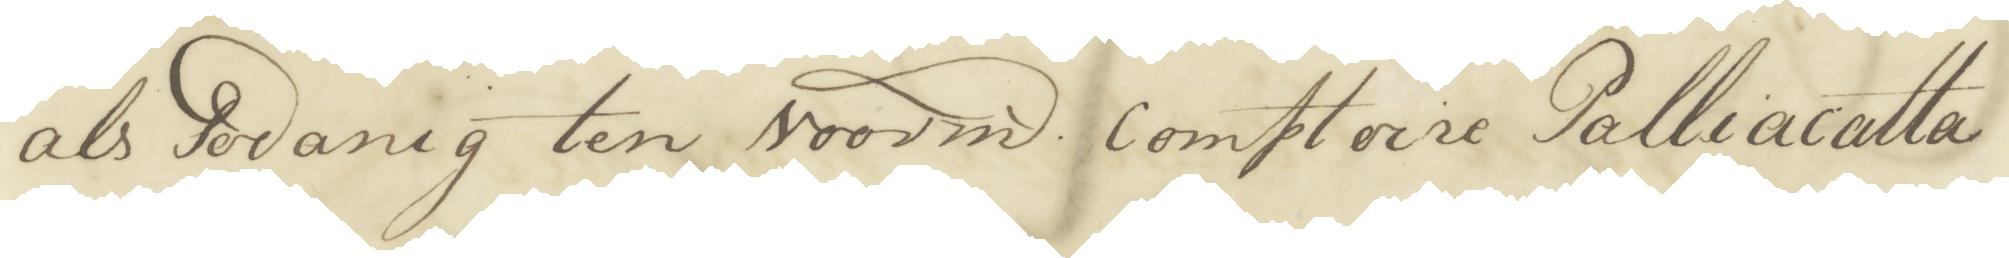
als sodanig ten voorm: comptoire Palliacatta
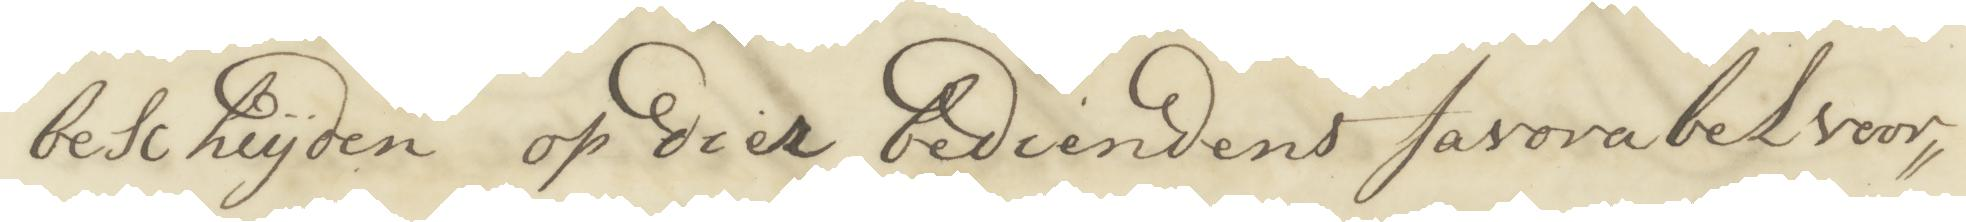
bescheijden op dier bediendens favorabel voor„
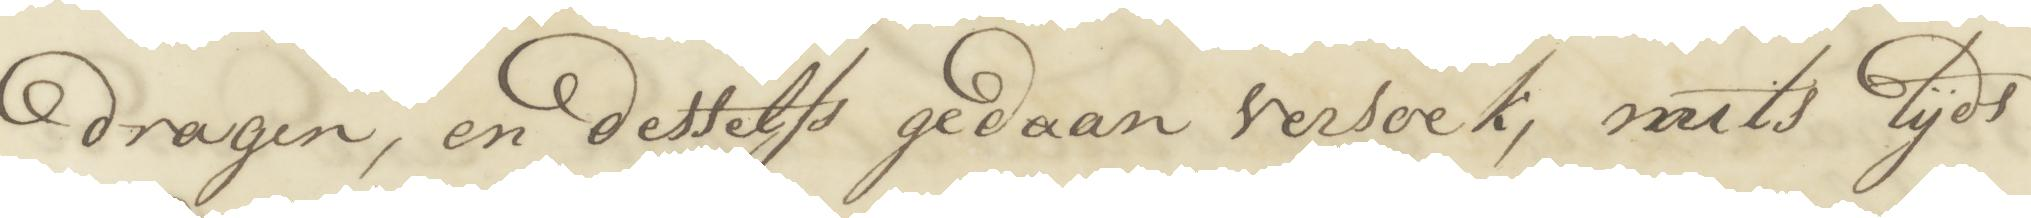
dragen, en desselfs gedaan versoek, mits tijds
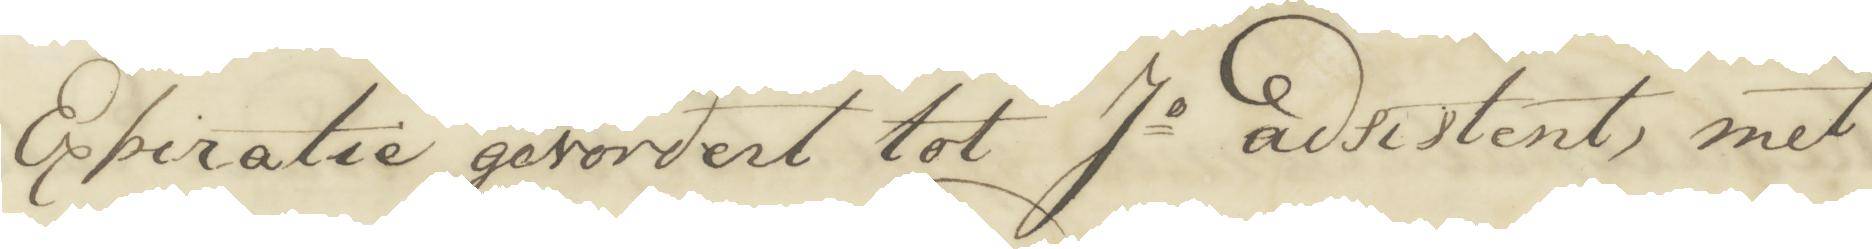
Expiratie gevordert tot J=o adsistent, met
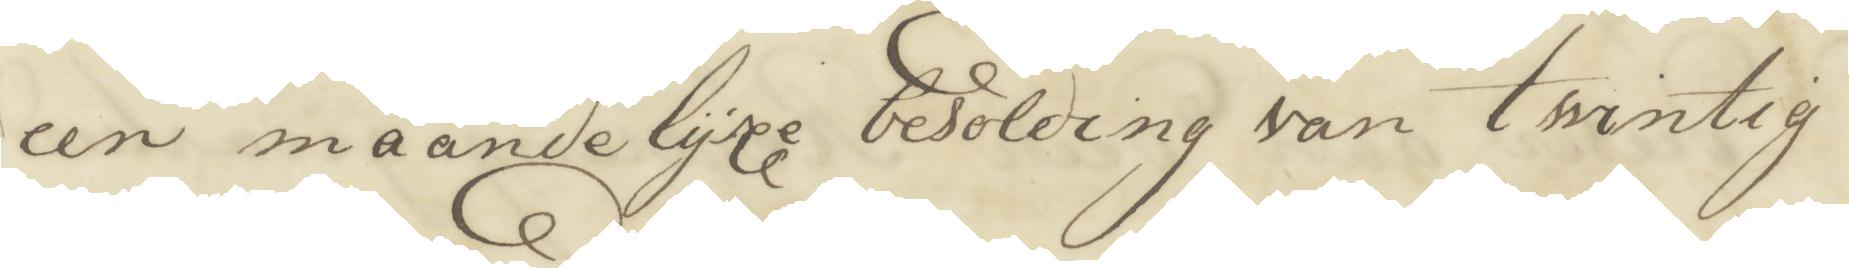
een maandelijxe besolding van twintig
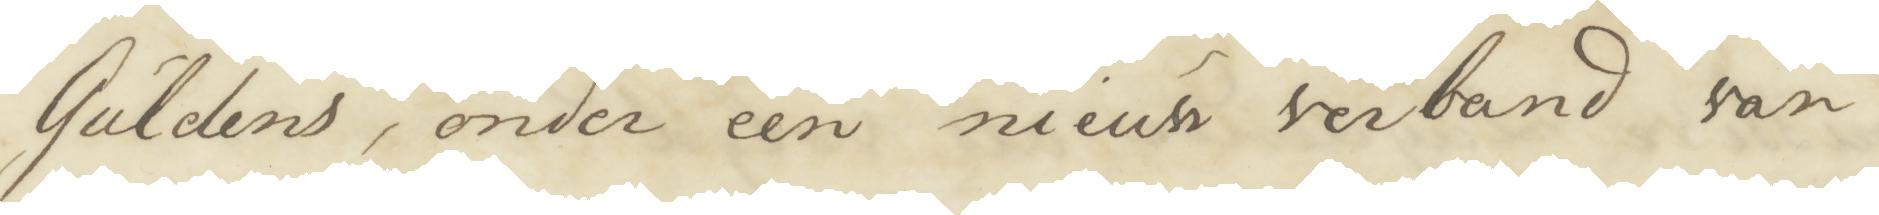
Guldens, onder een nieuw verband van
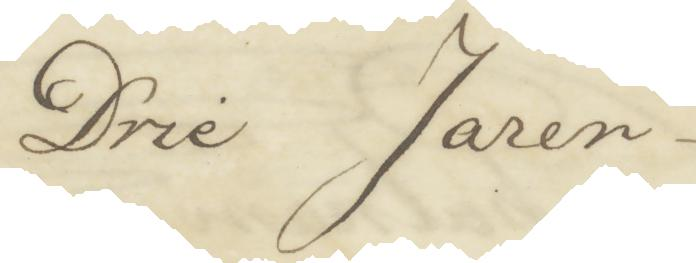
Drie Jaren
